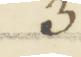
3
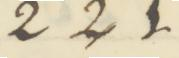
221
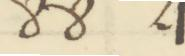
88 4
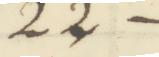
22 –
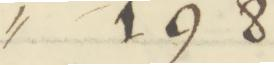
„ 198
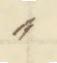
„ 59 4
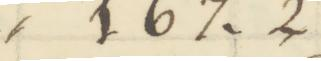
„ 167. 2
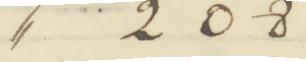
„ „ 208
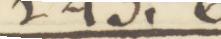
145. 6
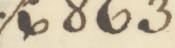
k 863.
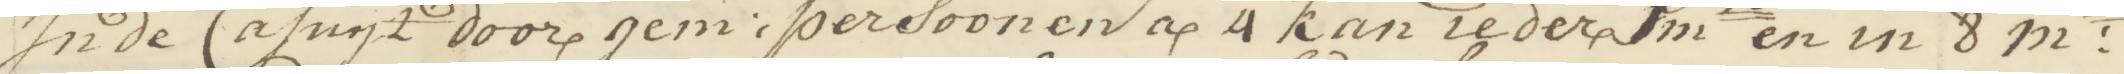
In de Cajuijt door gem: persoonen op 4 kan ieder sm=ts en in 8 m:=n
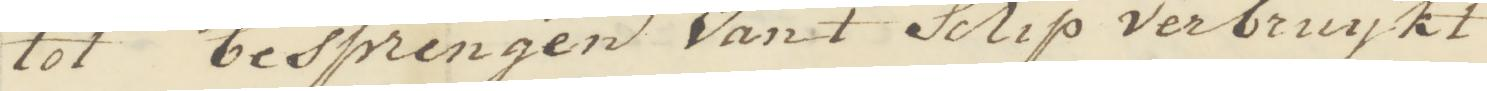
tot bespringen van t schip verbruijkt
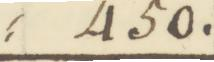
„ 450. –
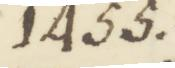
1455. –
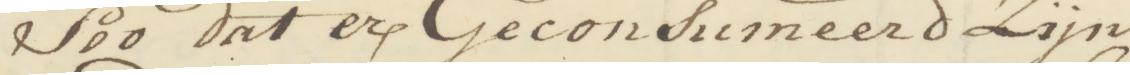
Soo dat er Geconsumeerd zijn
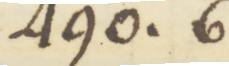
490. 6
